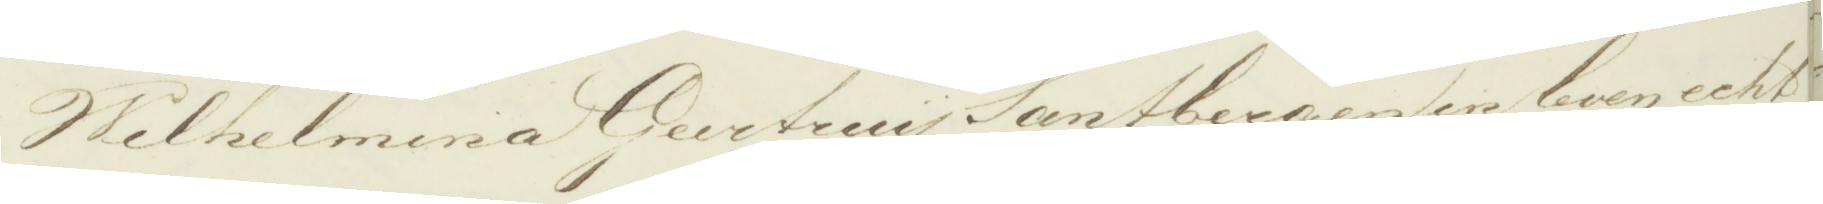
Wilhelmina Geertruij Santbergen in leven echt
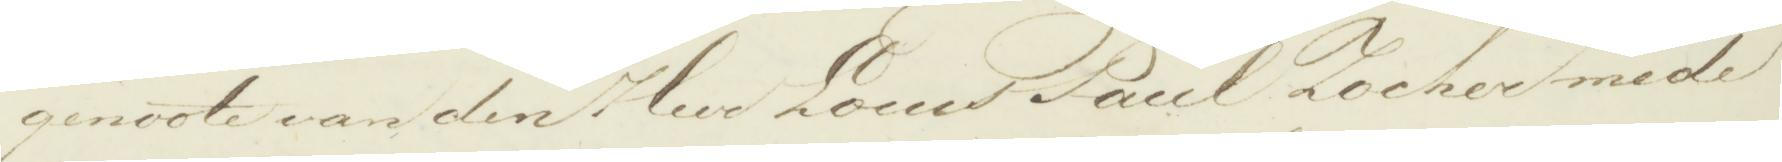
genoote van den Heer Louis Paul Zocher mede
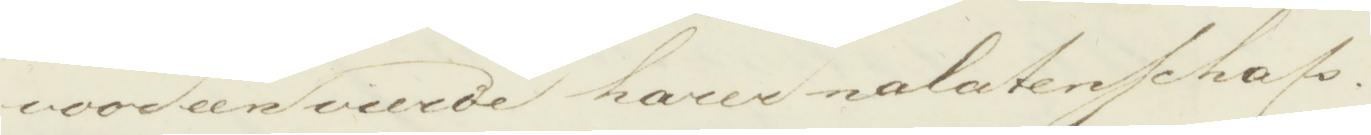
voor een vierde harer nalatenschap.
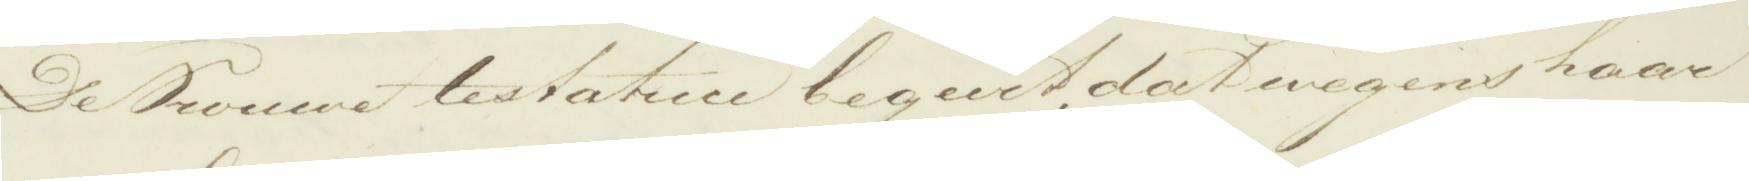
De Vrouwe testatrice begeert, dat wegens haar
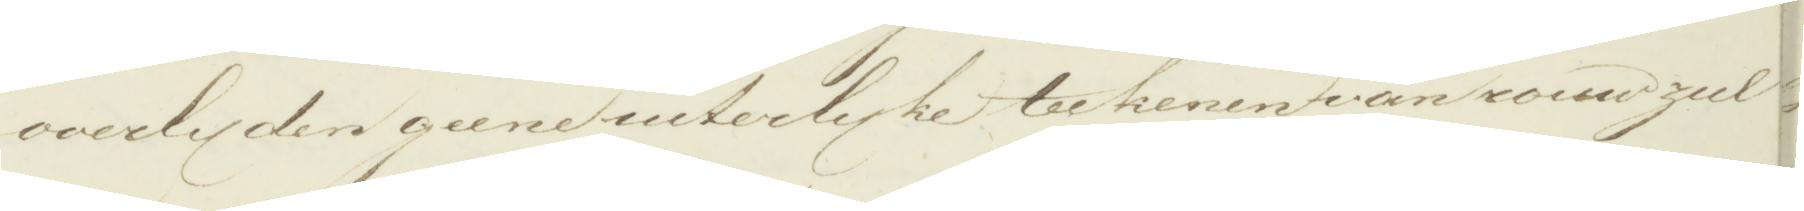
overlyden geene uiterlyke teekenen van rouw zul
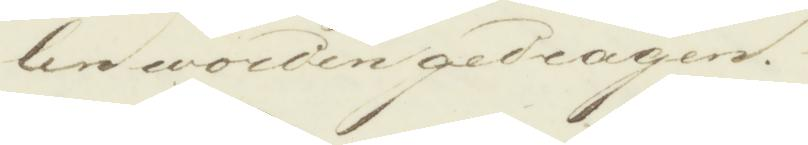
len worden gedragen.
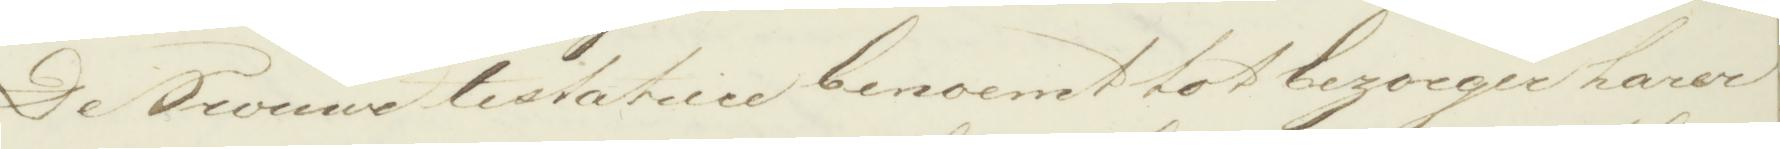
De Vrouwe testatrice benoemt tot bezorger harer
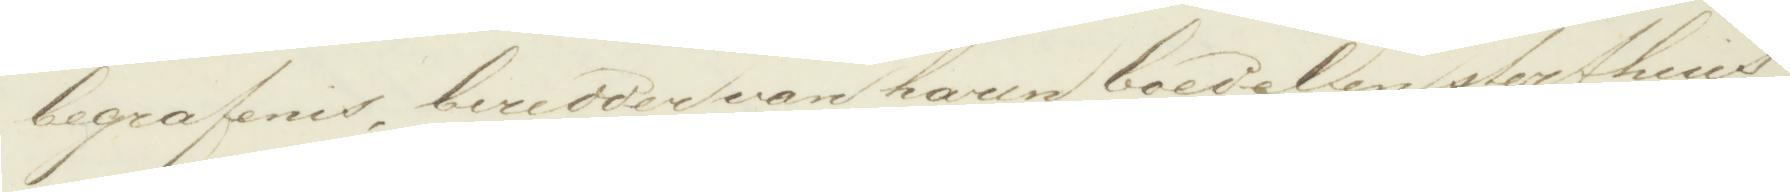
begrafenis, beredder van haren boedel en sterfhuis
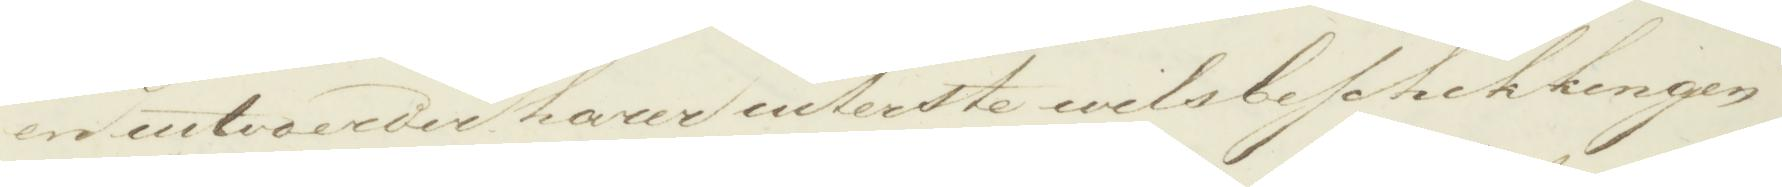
en uitvoerder harer uiterste wils beschikkingen
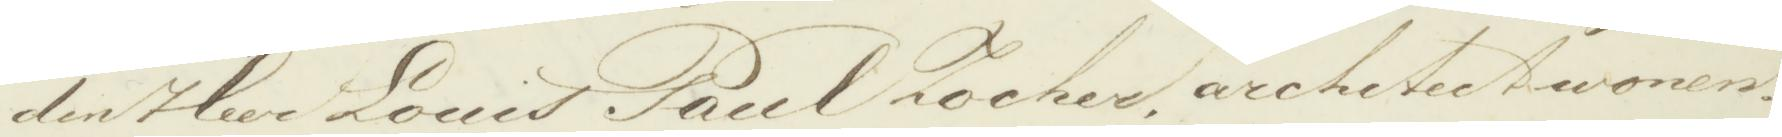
den Heer Louis Paul Zocher, architect wonen„
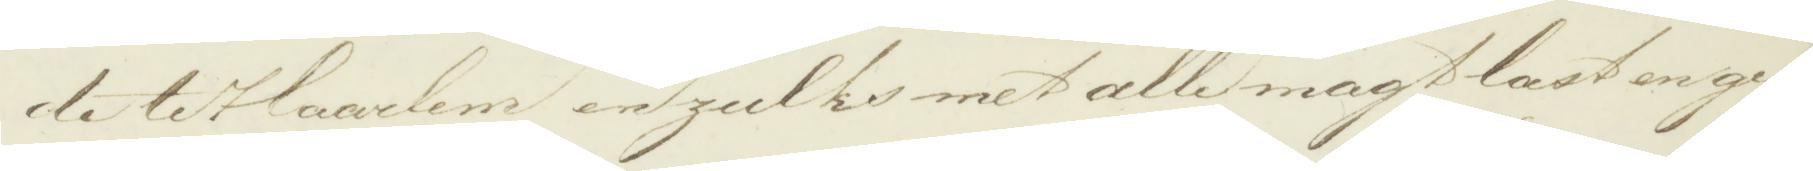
de te Haarlem en zulks met alle magt last en ge
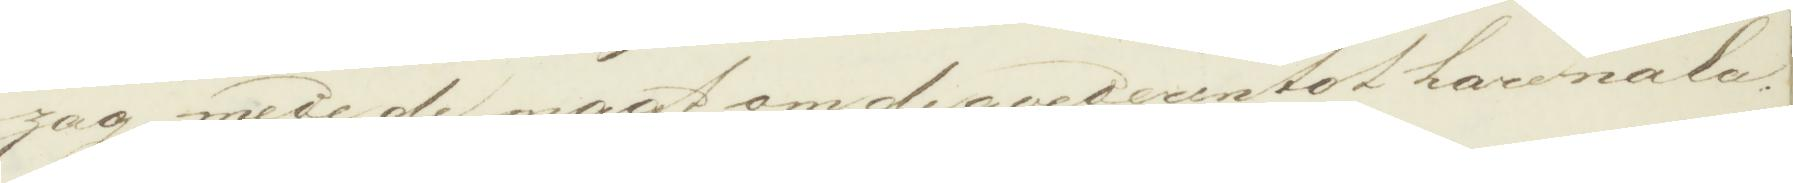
zag mede de magt om de goederen tot hare nala„
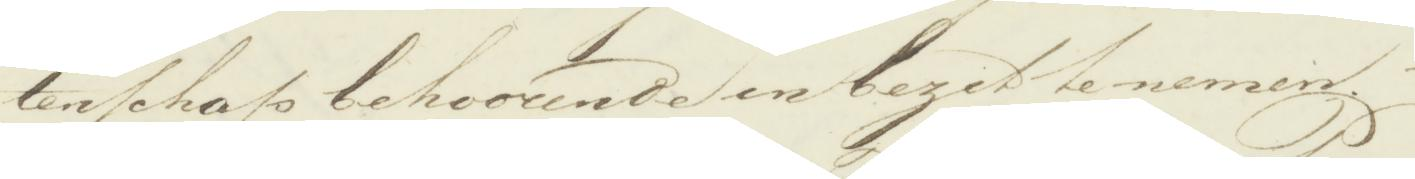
tenschap behoorende in bezit te nemen
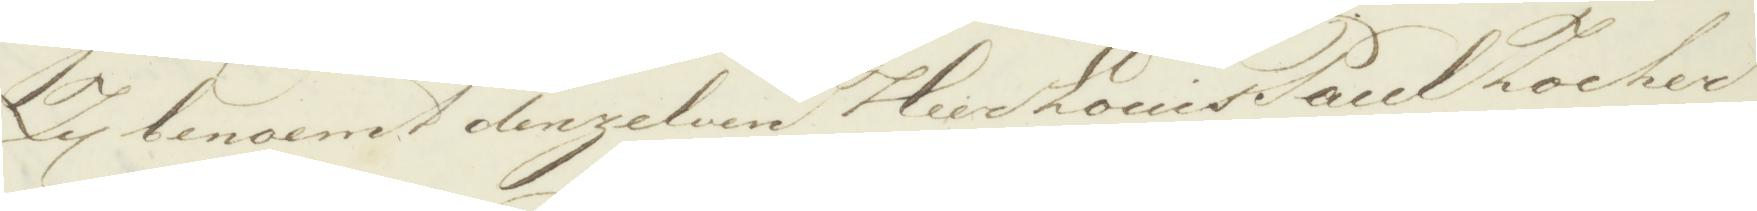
Zy benoemt denzelven Heer Louis Paul Zocher
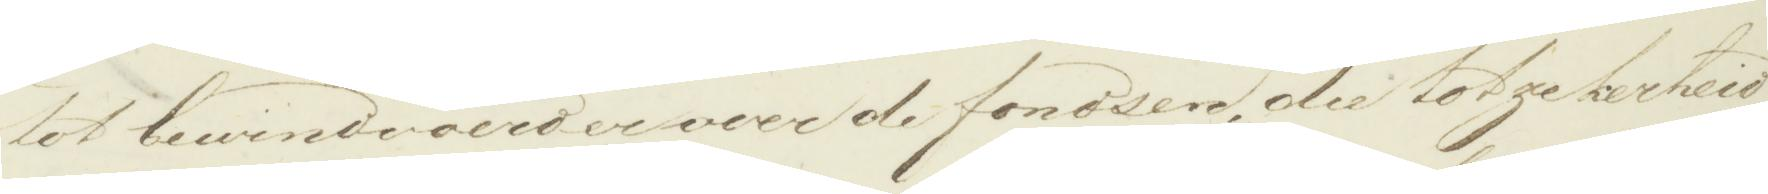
tot bewindvoerder over de fondsen, die tot zekerheid
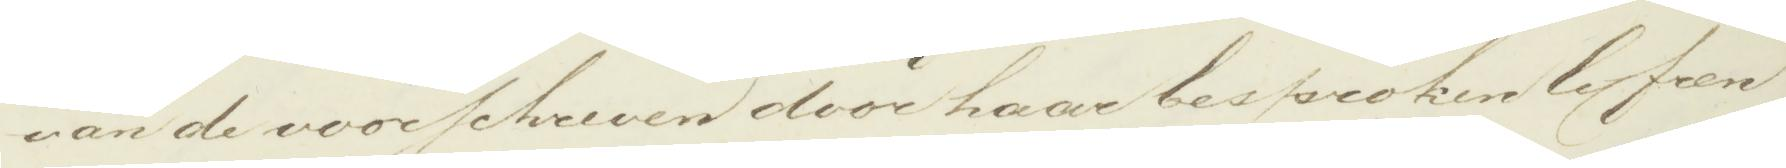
van de voorschreven door haar besproken lyfren
